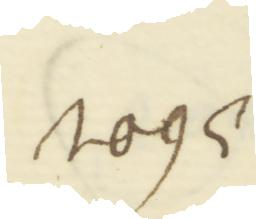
1095
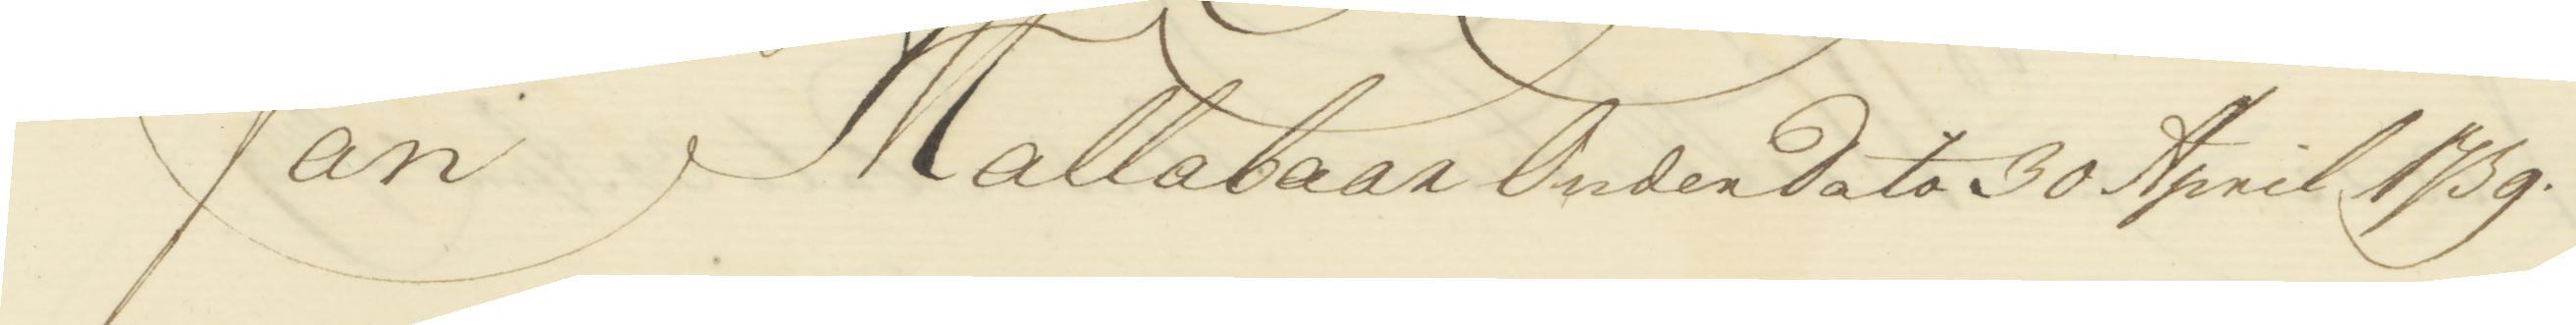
Van Mallabaar Onder dato 30 April 1739.
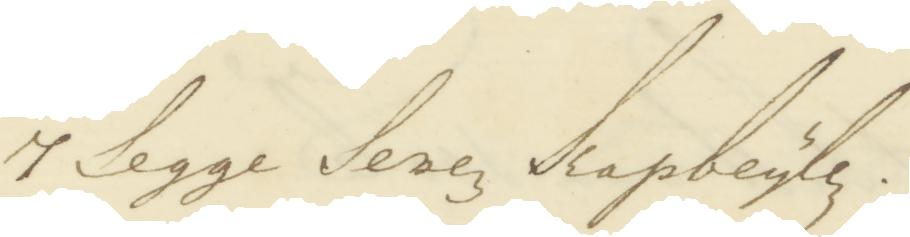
7 segge seven kapbeijlen.
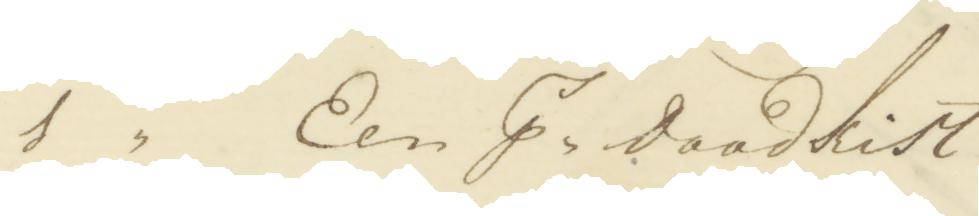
1 „ Een p„s doodkist
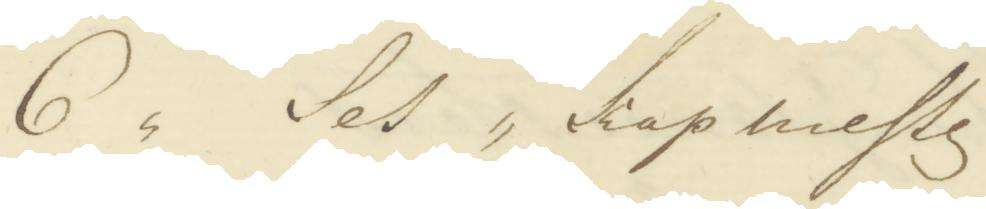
6 „ ses „ kap messen
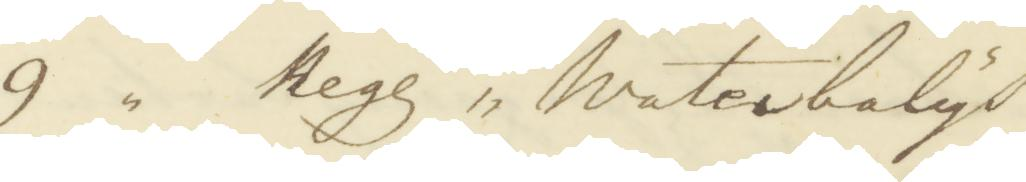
9 „ negen „ waterbalijs
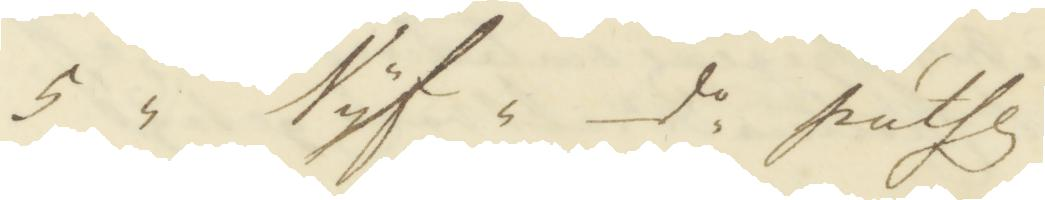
5 „ Vijf „ _„o putsen
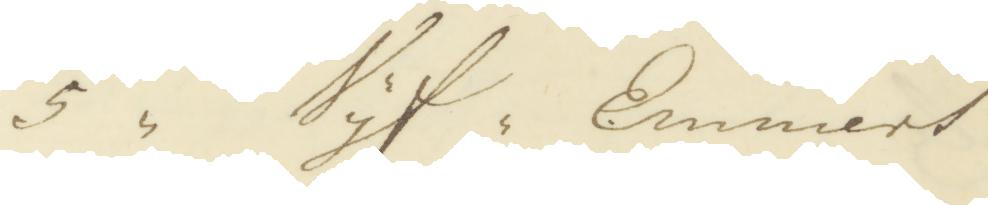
5 „ Vijf„ Emmers
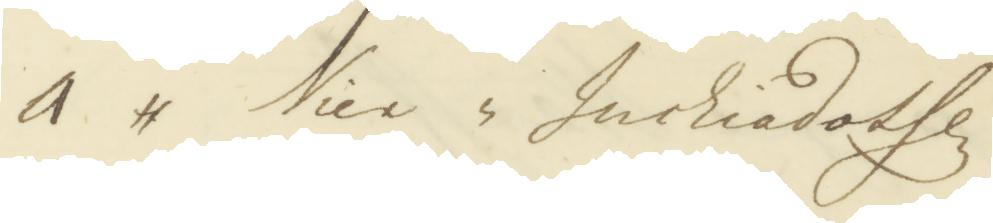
4 „ Vier „ Inchiadossen
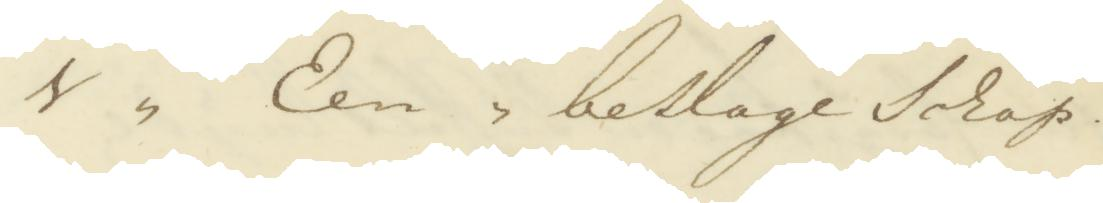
1 „ Een „ beslage schap
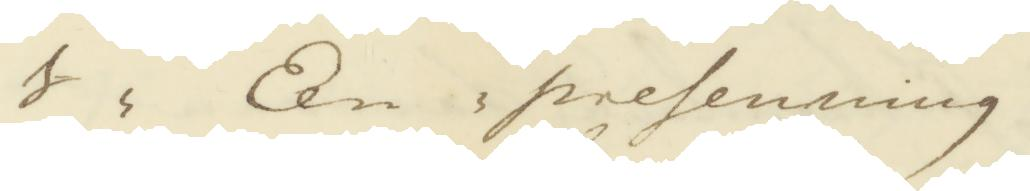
1 „ Een „ presenning
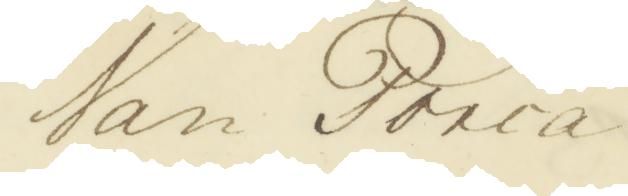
Van Porca
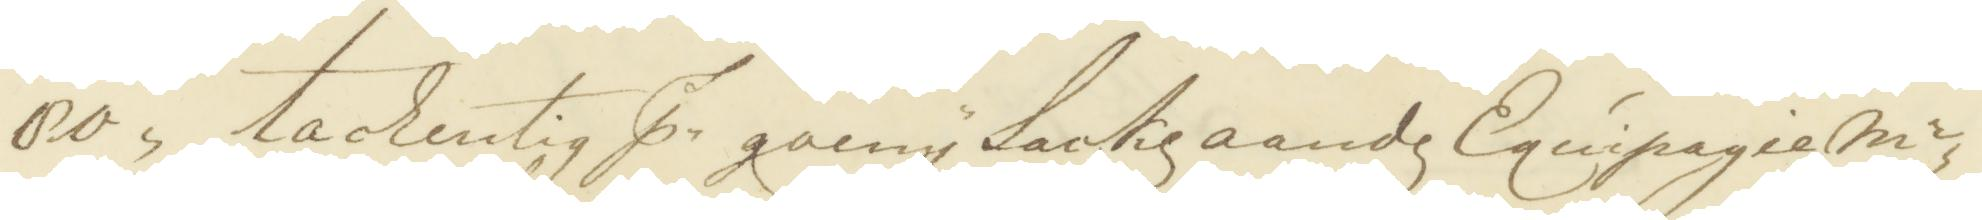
80 „ tachentig p„s goenij sacken aan den Equipagie m„r
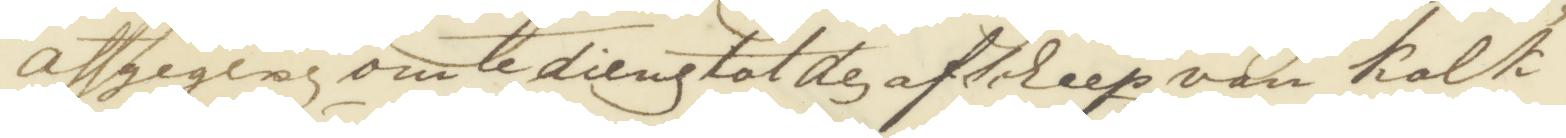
affgegeven om te dienen tot den afscheep van kalk
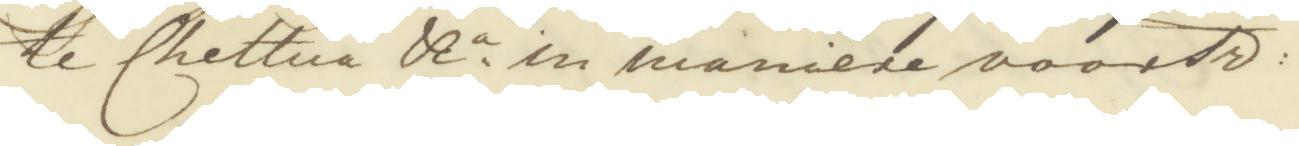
te Chettua &„a in maniere voorsz:
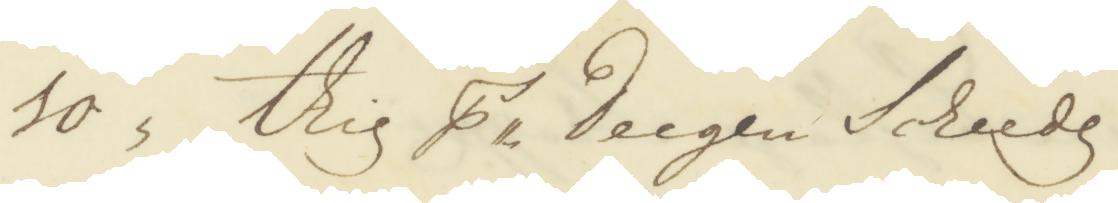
10 „ thien p„s deegen scheeden
